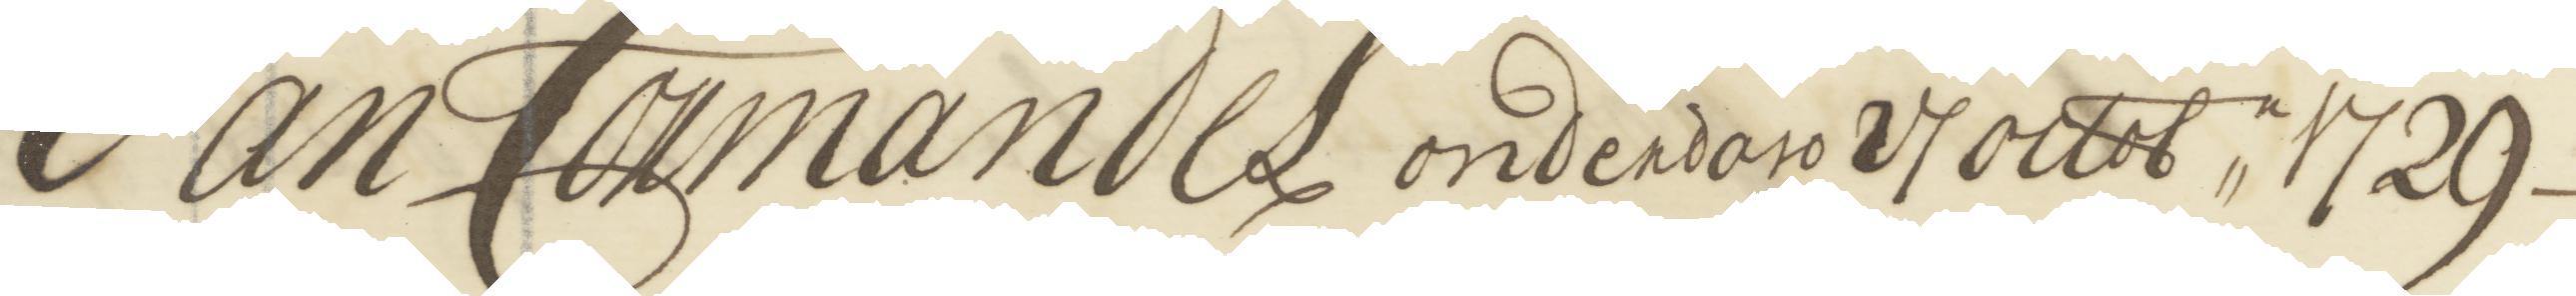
Van Cormandel onderdato 27 octob„r 1729
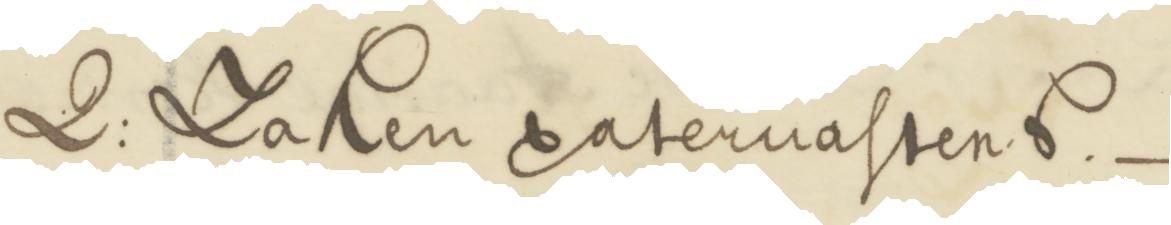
2: Zaken paternasters. —
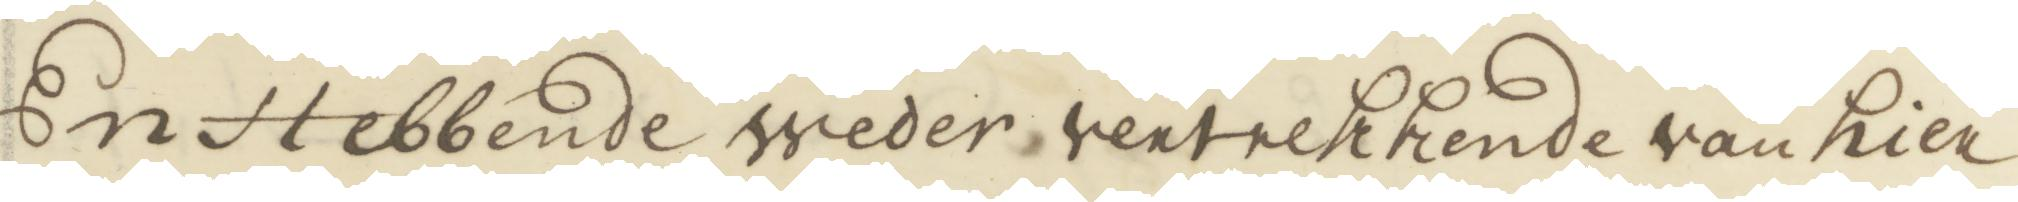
En Hebbende weder vertrekkende van hier
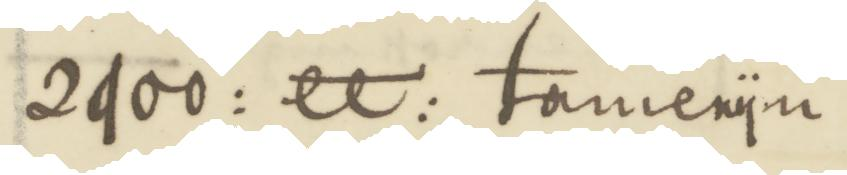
2400: lb: tamerijn
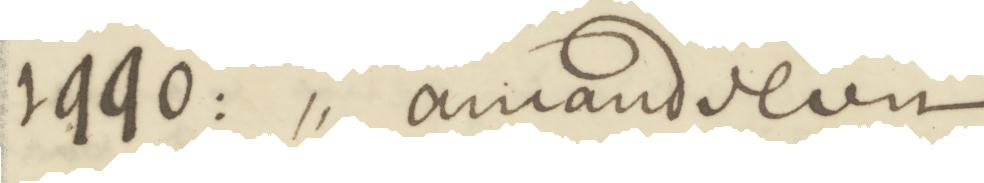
1440: „ amandelen
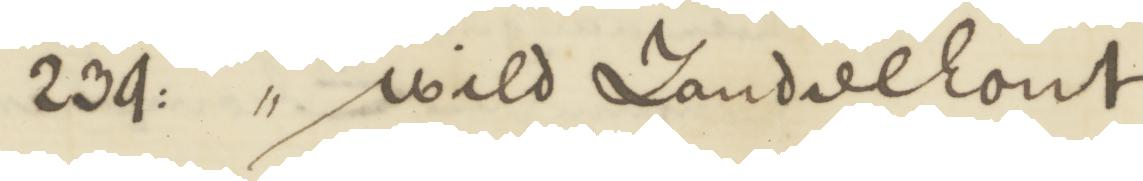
234: „ wild zandelhout
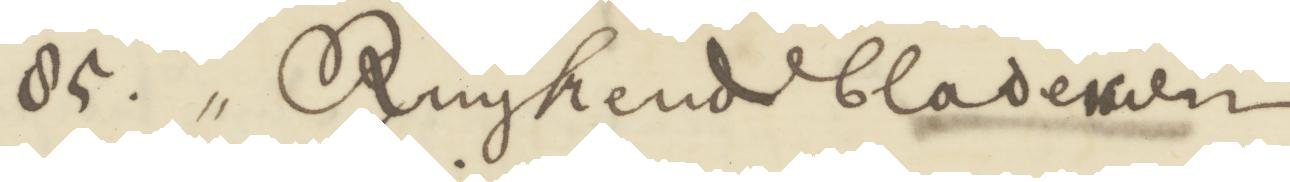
85. „ Ruijkende bladeren
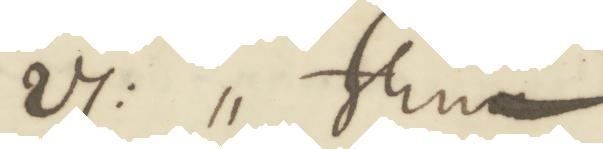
27: „ thin
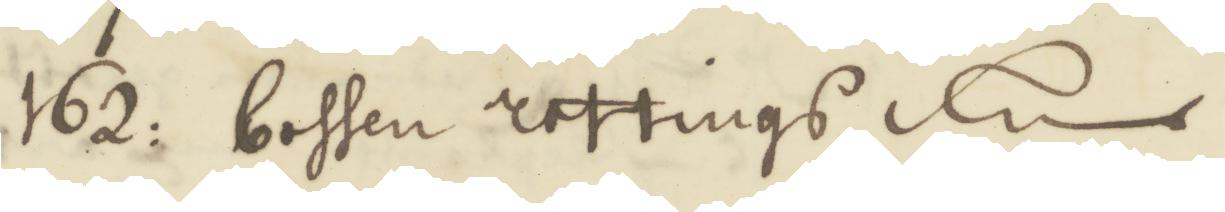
162: bossen rottings En
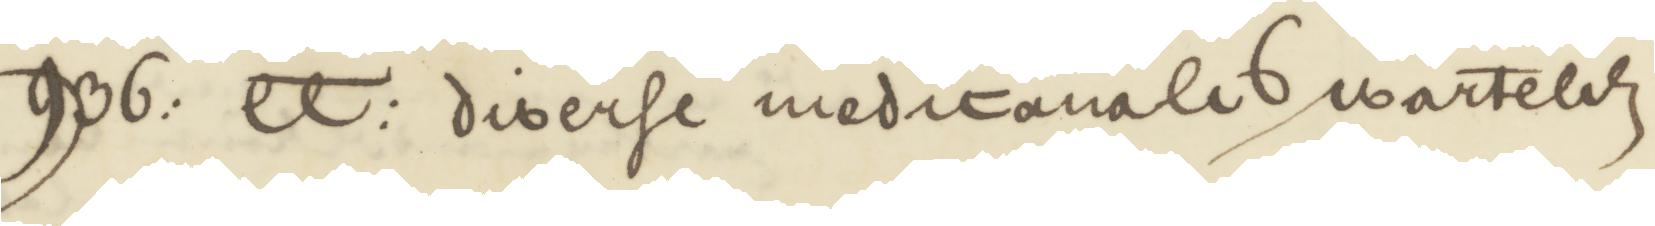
936: lb: diverse medicanalis wartelen
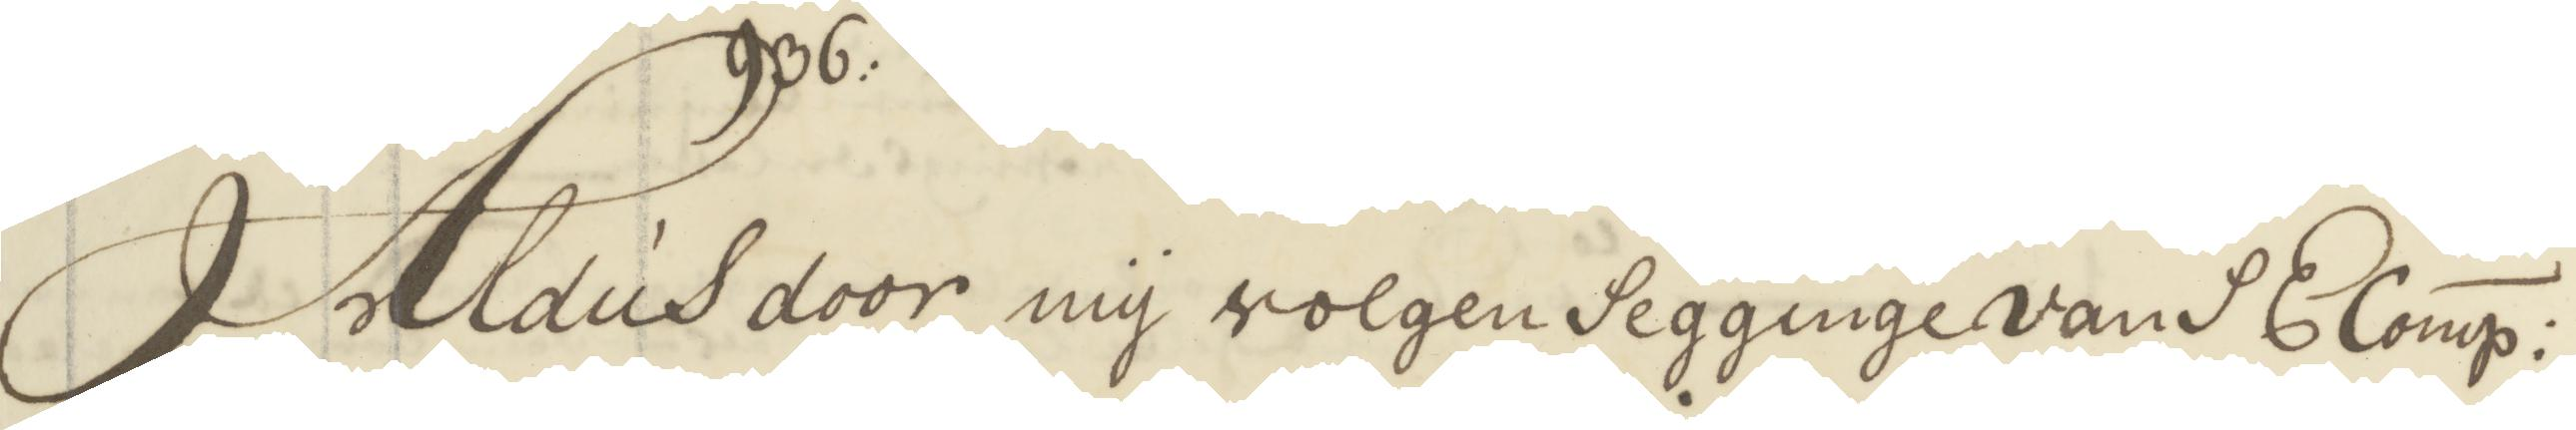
Aldus door mij volgen segginge van s E Comp:
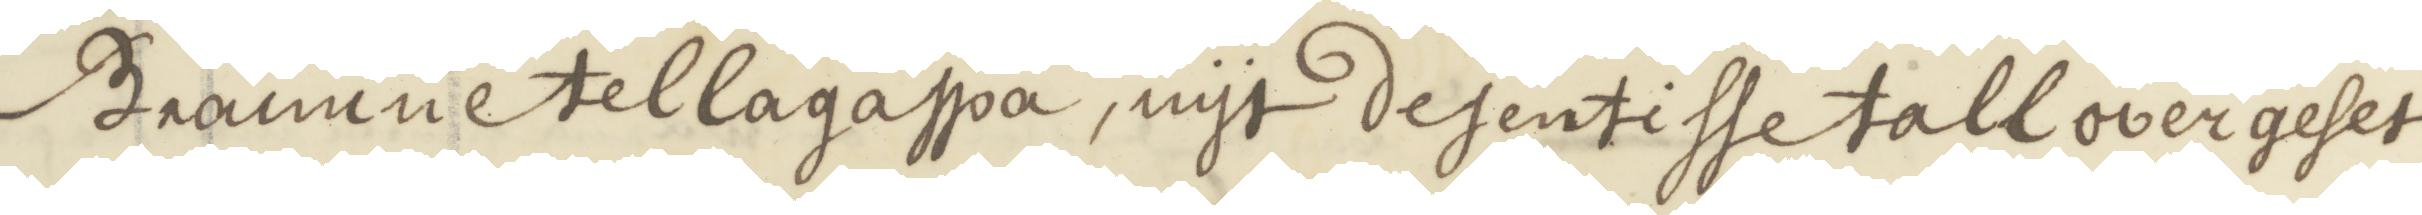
Bramine tellagappa, uijt de jentisse tall over geset
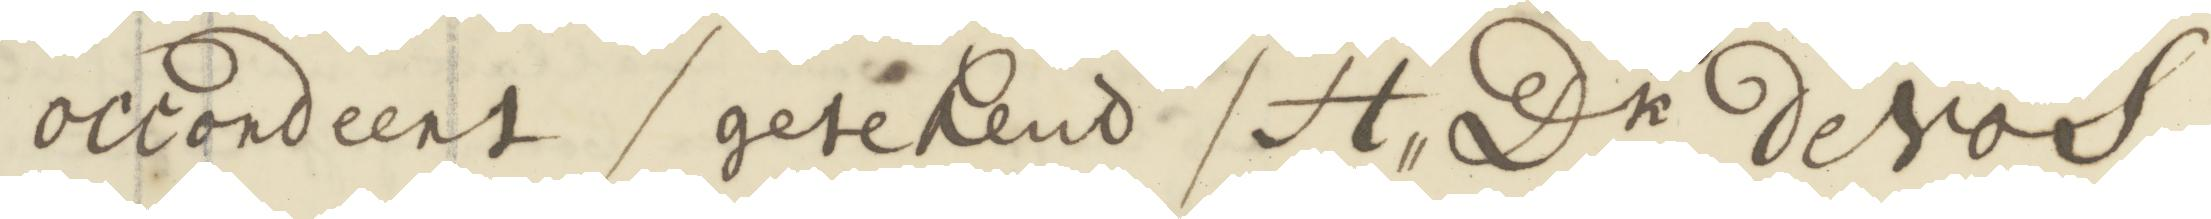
occordeert / getekend / H„ D„k de vos
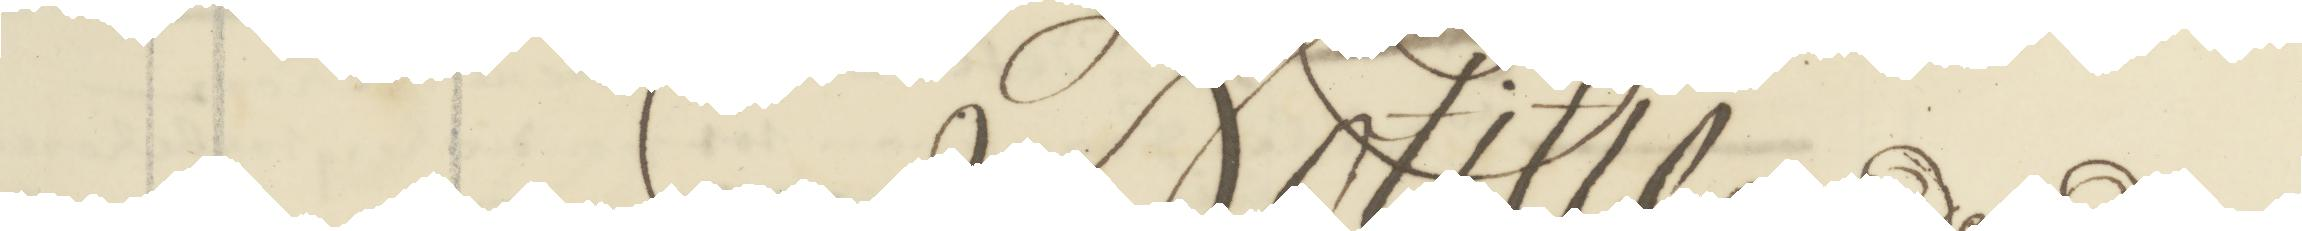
E: Clercq lager accordeert / en getekend / J„s
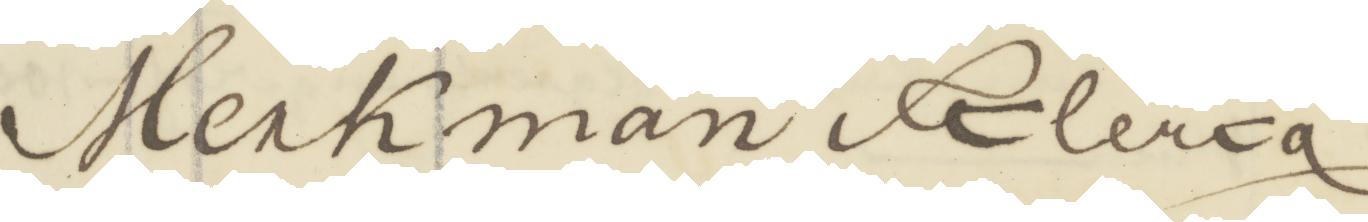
Merkman Eclercq
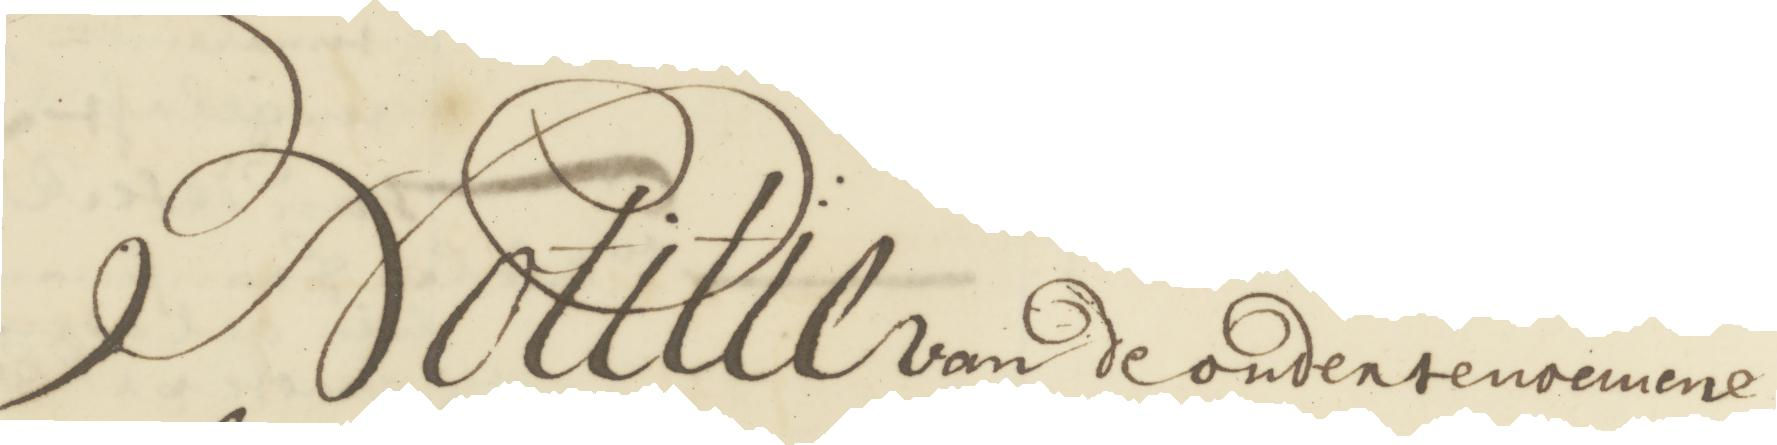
Notitie van de onder te noemen
